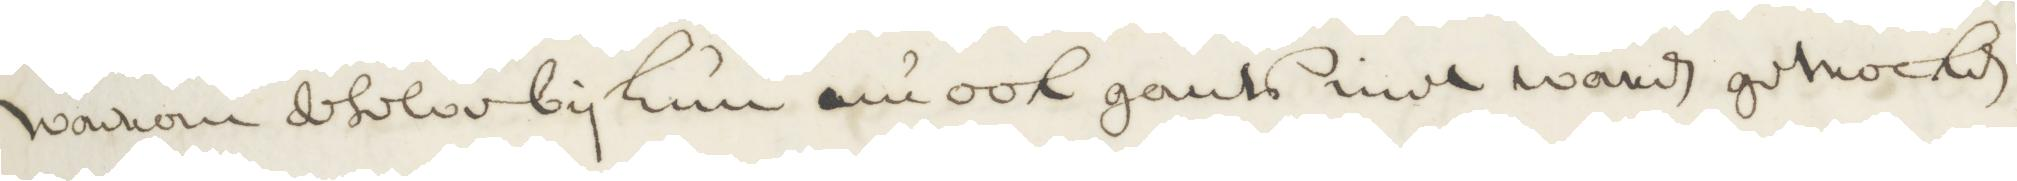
waerom deselve bij hun nu ook gants niet waren getrocken,
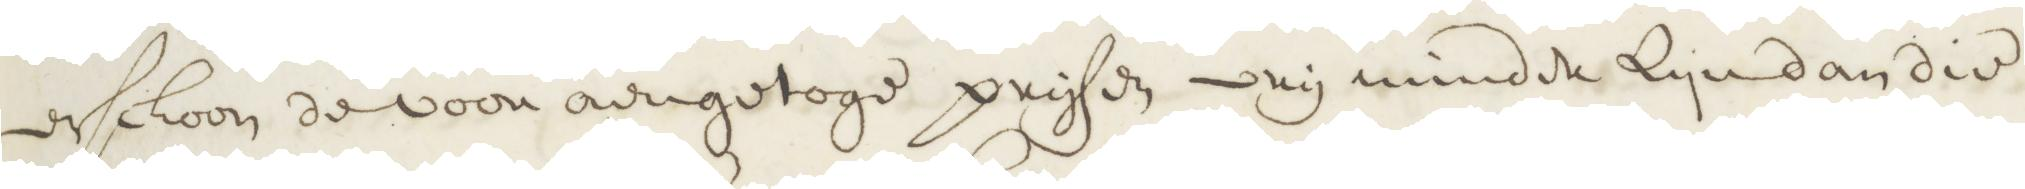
en schoon de voor aengetoge prijsen vrij minder zijn dan die
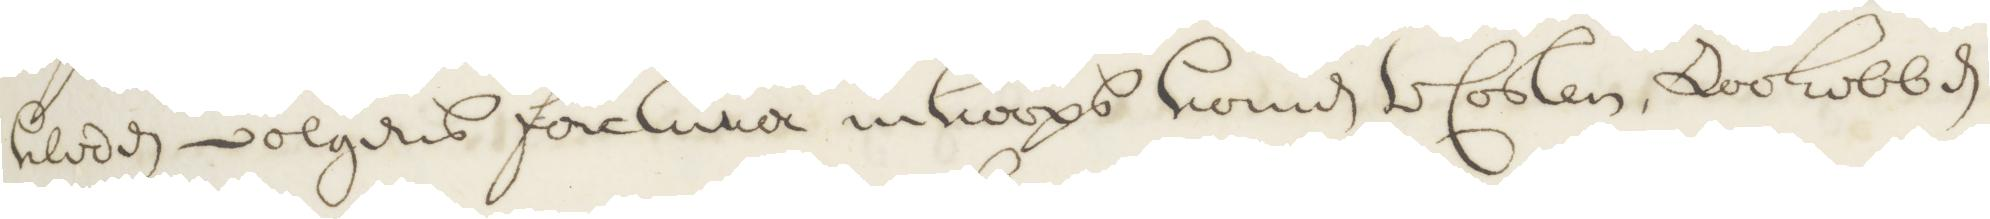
kleden volgens factura inkoops komen te Costen, zoo hebben
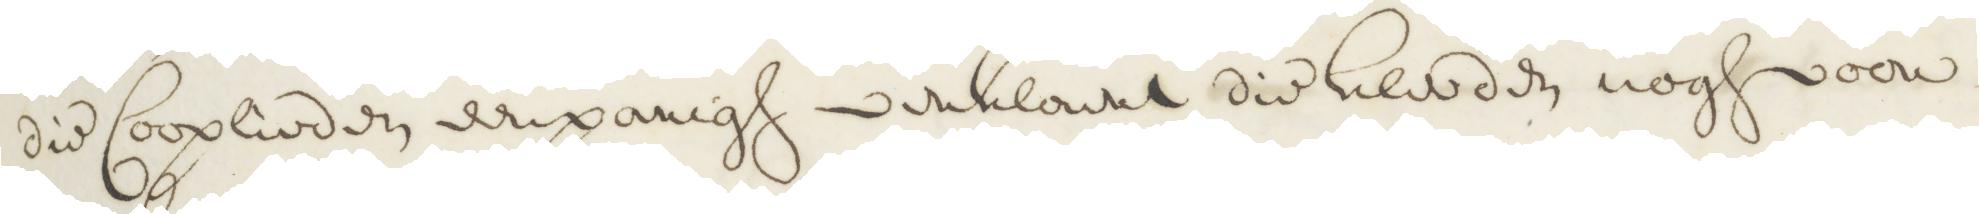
die Cooplieden eenparigh verklaert die kleeden nogh voor
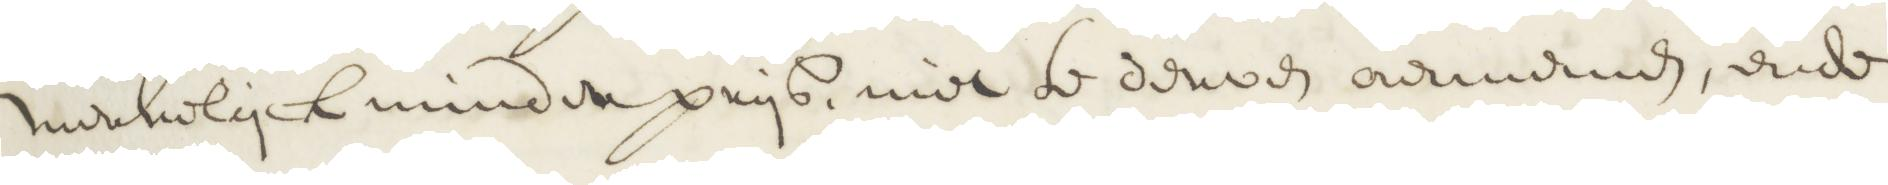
merkelijck minder prijs, niet te derven aennemen, ende
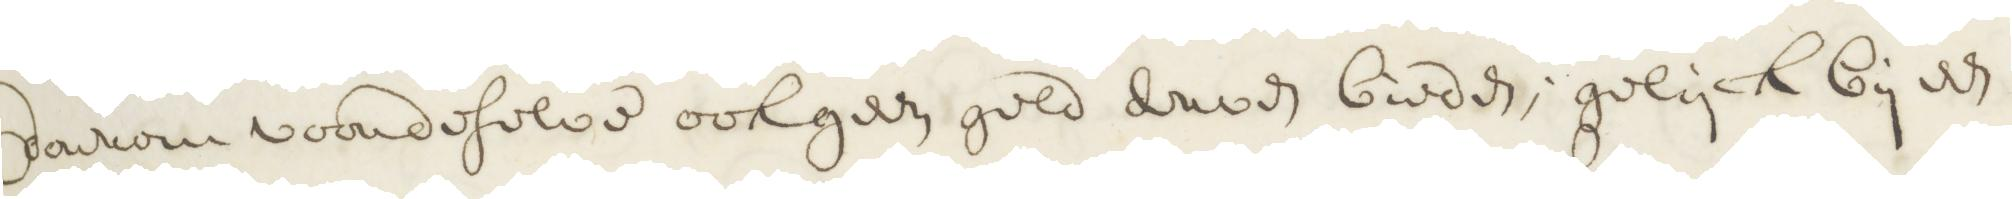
daerom voor deselve ook geen geld derven bieden; gelijck bij een
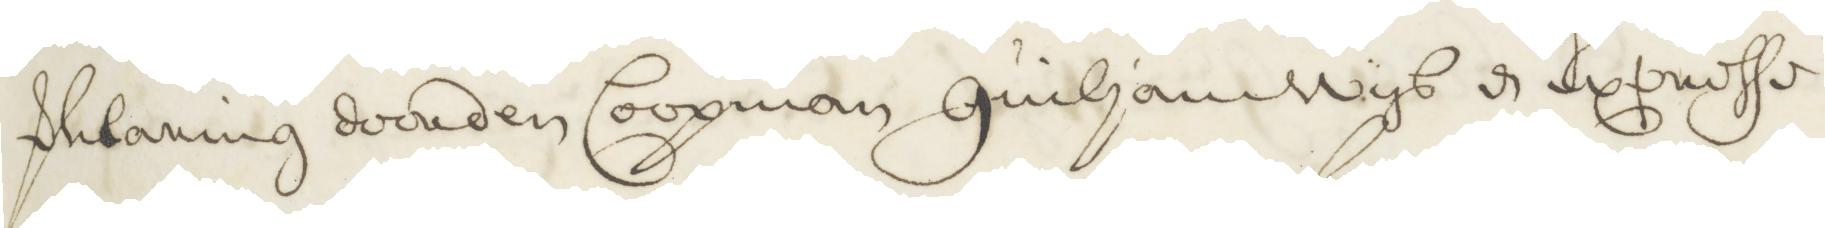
verklaring door den Coopman guiljam wijs en Expresse
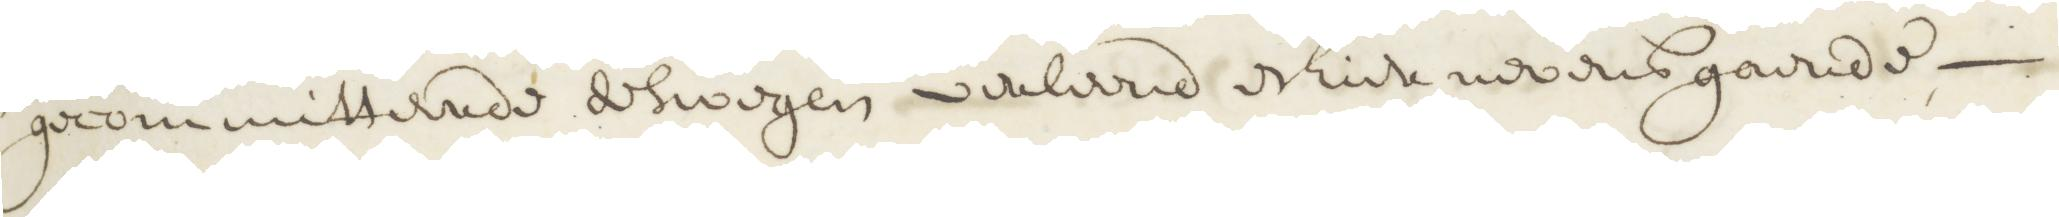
gecommitteerde deswegen verleend en hier nevens gaende —
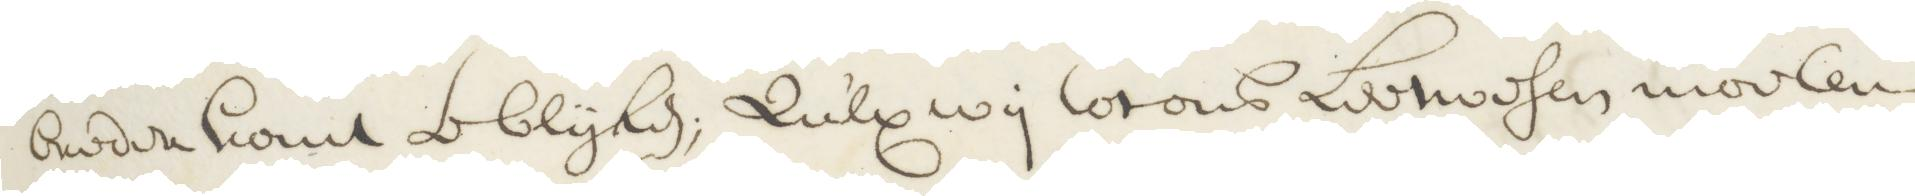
breder komt te blijken; zulx wij tot ons Leetwesen moeten
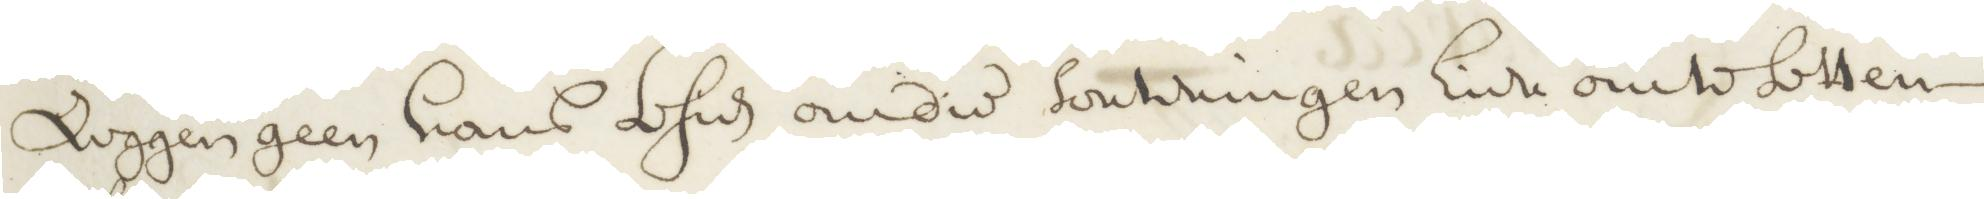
zeggen geen kans te sien om die sorteringen hier om te setten
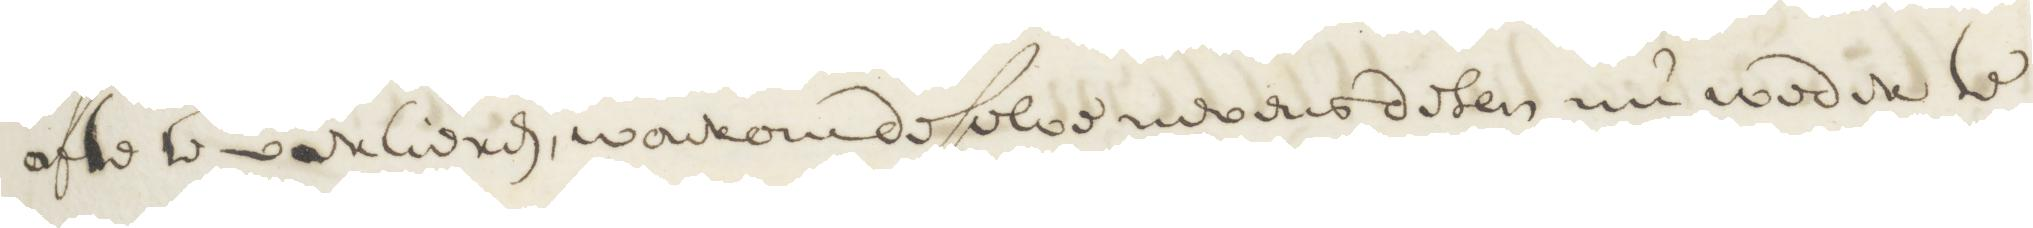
ofte te vertieren, waerom deselve nevens desen nu weder te
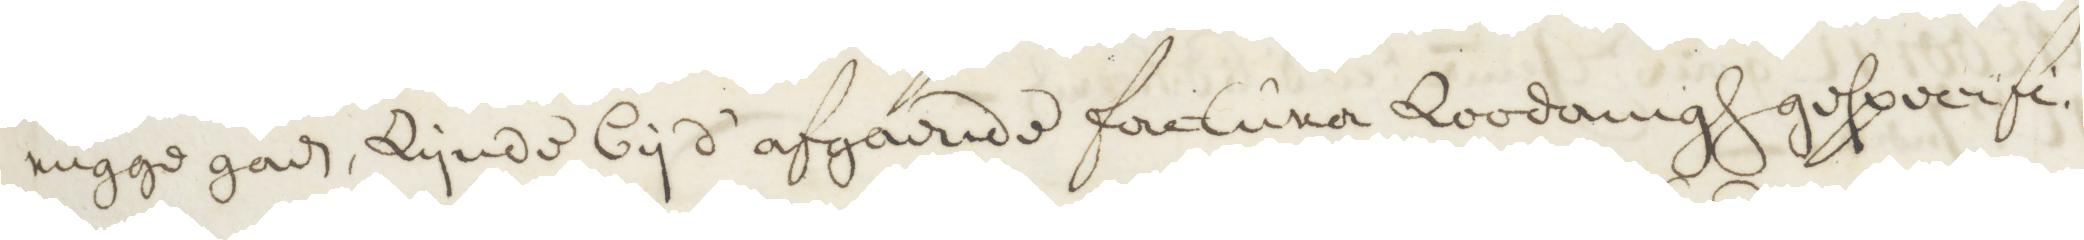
rugge gaen, zijnde bij d’ afgaende factura zoodanigh gespecifi,
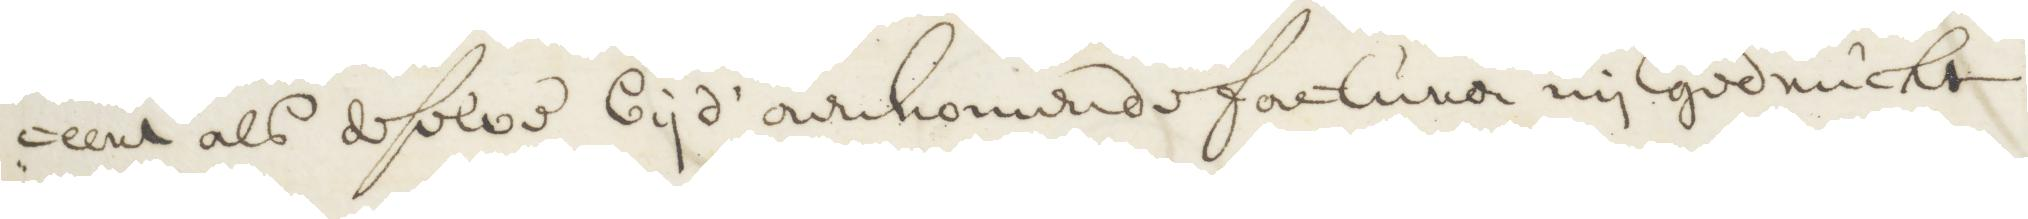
„ceert als deselve bij d’ aenkomende factura uijt gedruckt
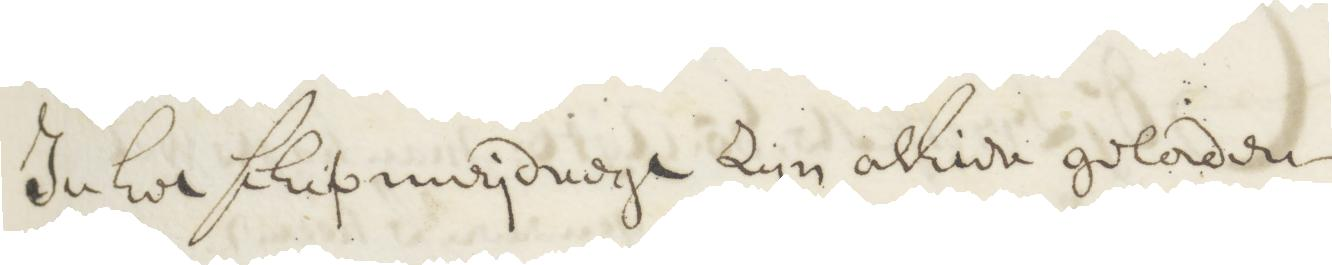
In het schip meijdregt zijn alhier geladen
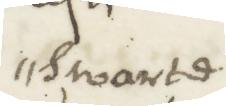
„swarte
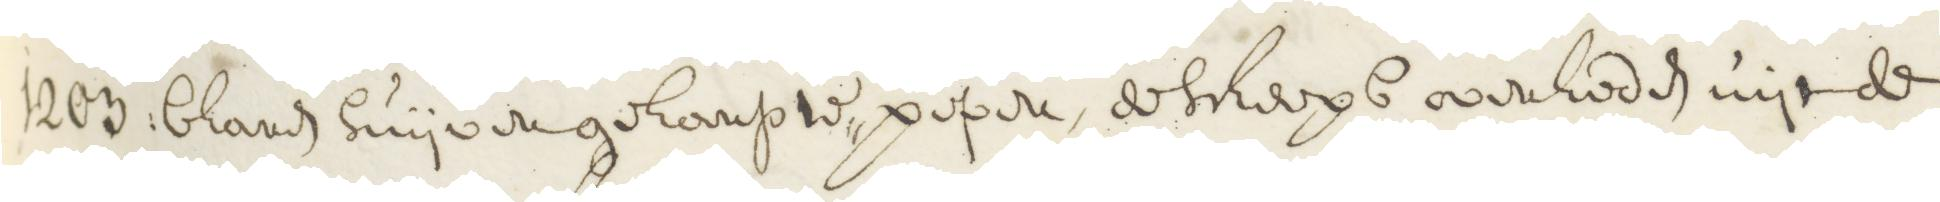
1203: bharen suijver geharpte „ peper, de scheeps overheden uijt de
